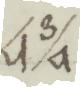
4¾
